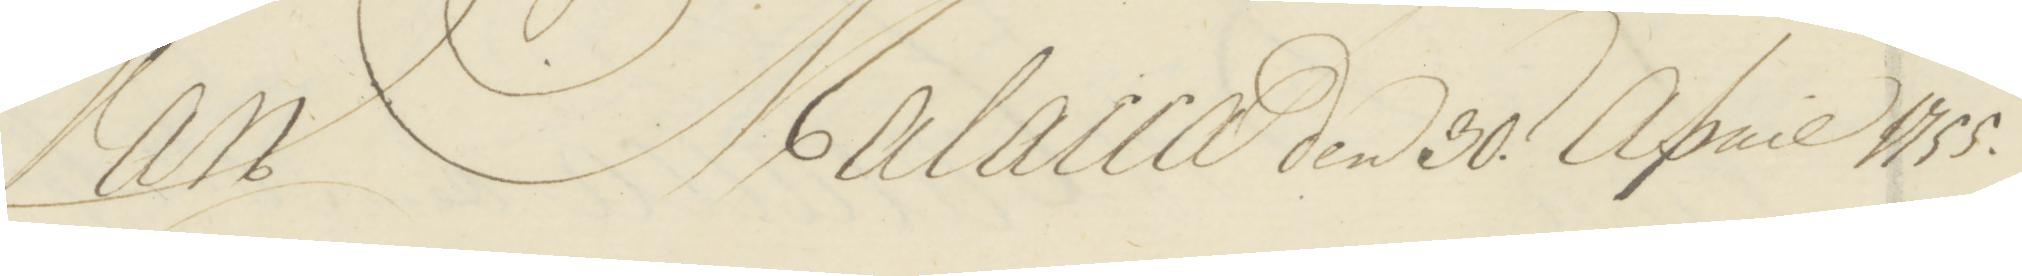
Van Malacca den 30.' April 1755.
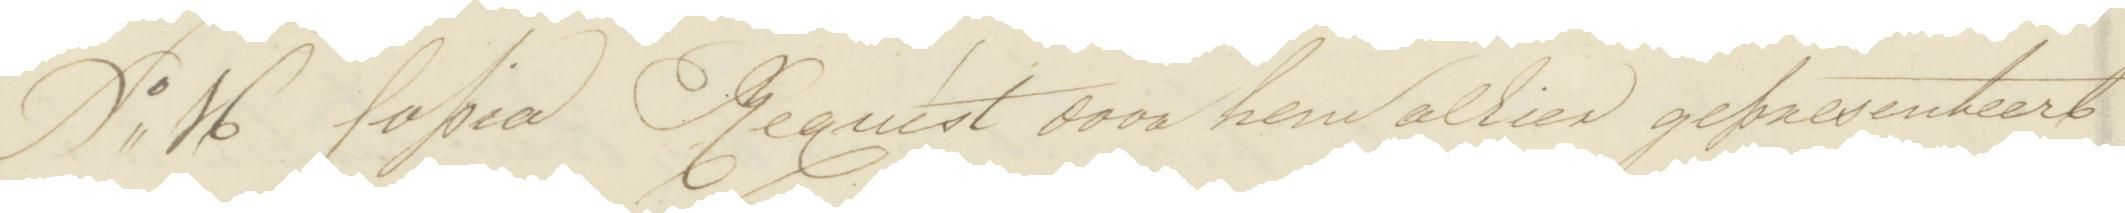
N„o 16 Copia Request door hem alhier gepresenteert
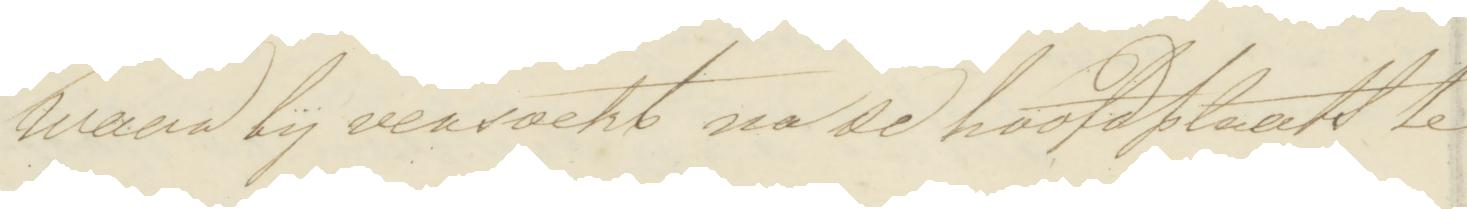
waar bij versoekt na de hoofdplaats te
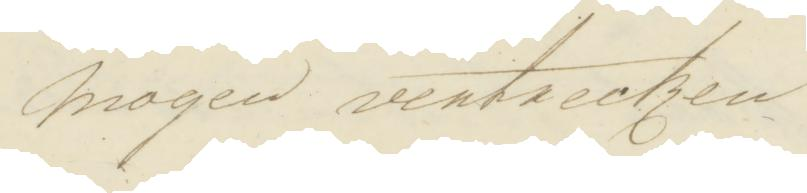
mogen vertrecken
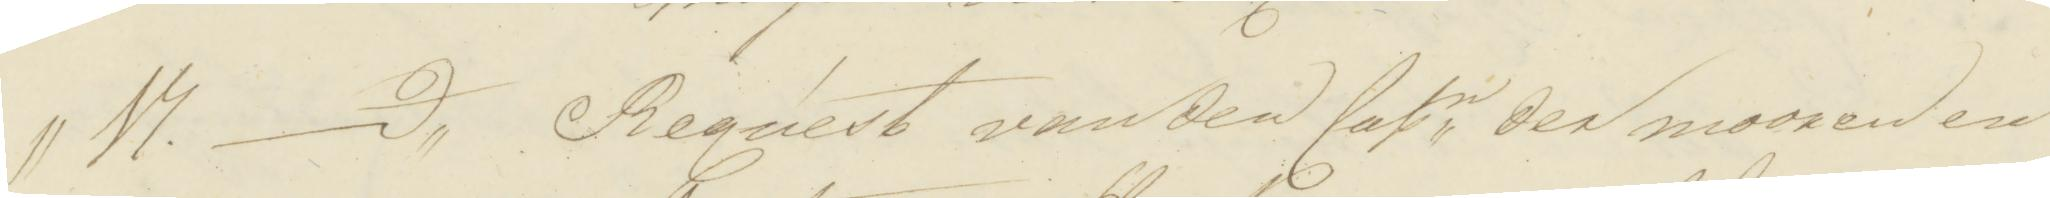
„ 17 —d„ Request van den Cap„n der mooren en
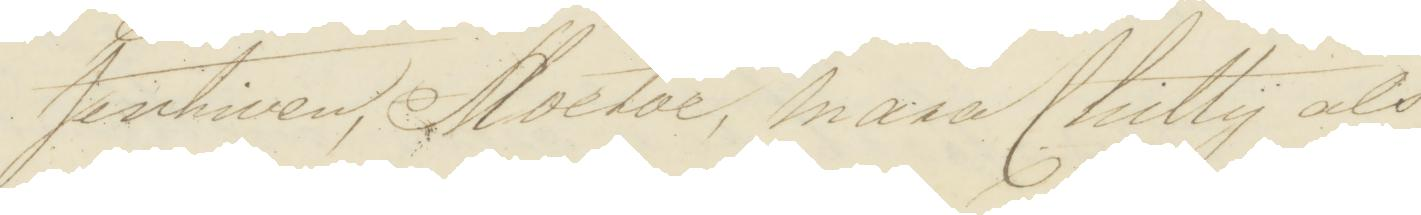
Jarhiven, Moetoe, mara Chittij als
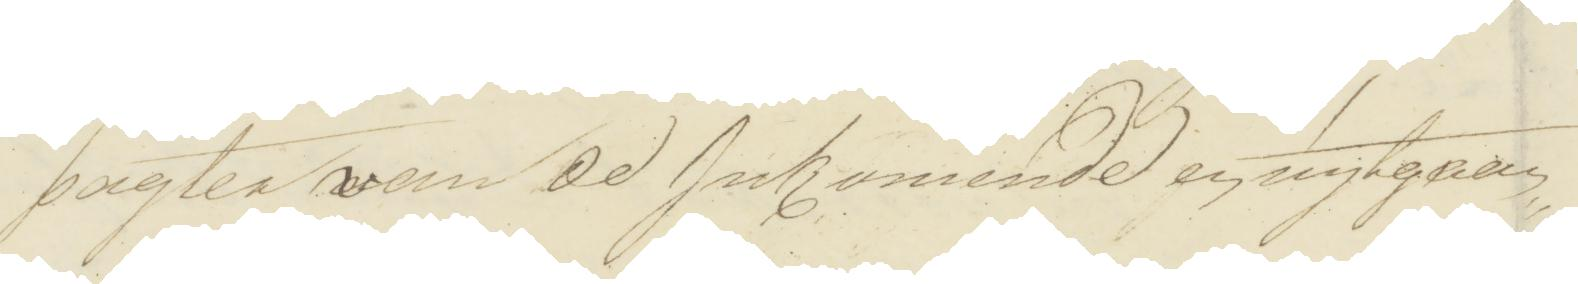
pagter van de Jnkomende en uijtgaan„
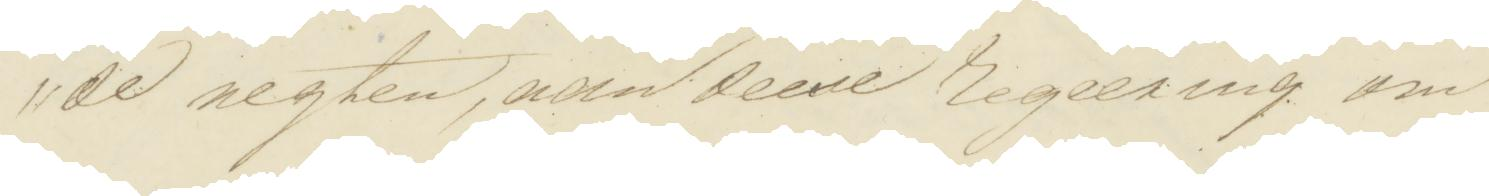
„de regten, aan deese Regeering om
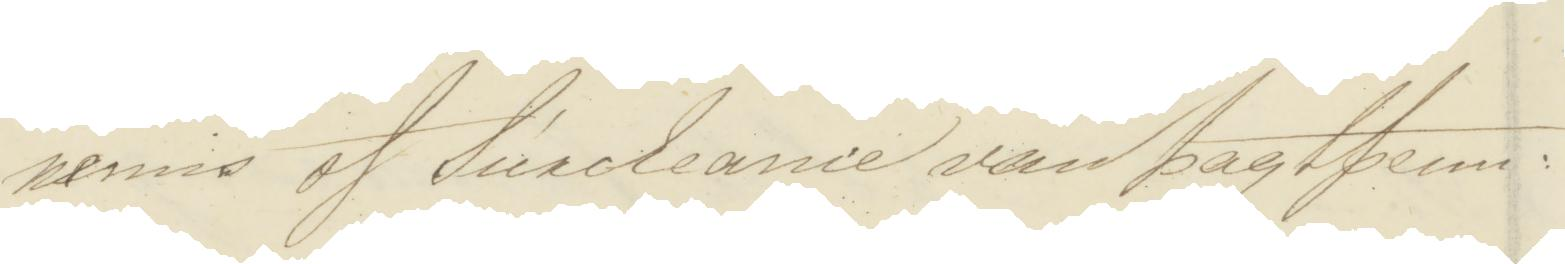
remis of surcheance van pagtpenn:
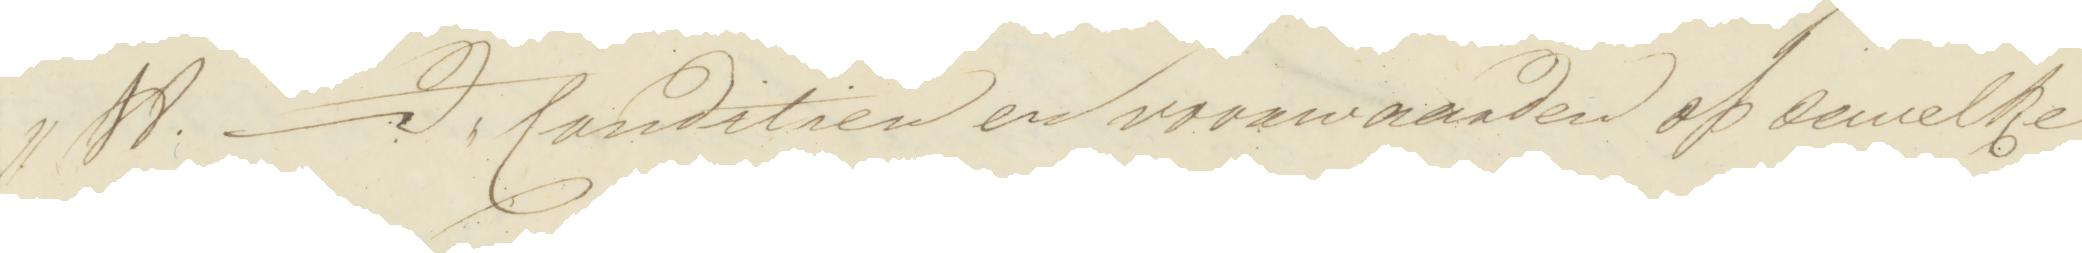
„ 18.—d„ Conditien en voorwaarden op dewelke
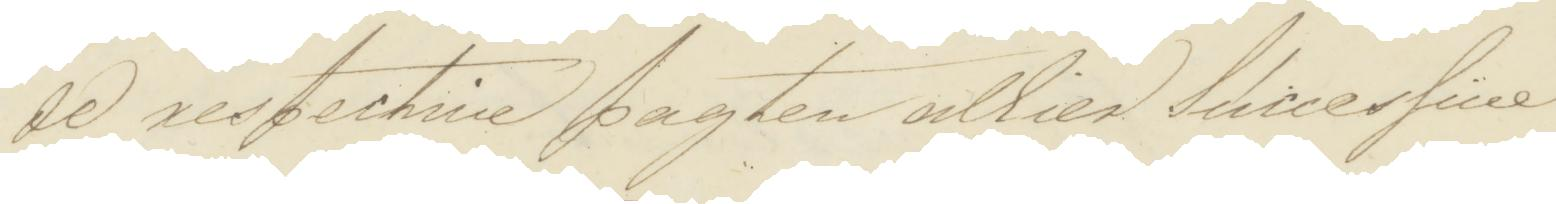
de respective pagten alhier successive
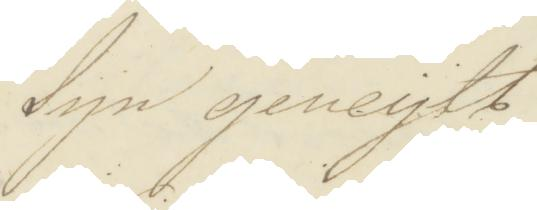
sijn geveijlt
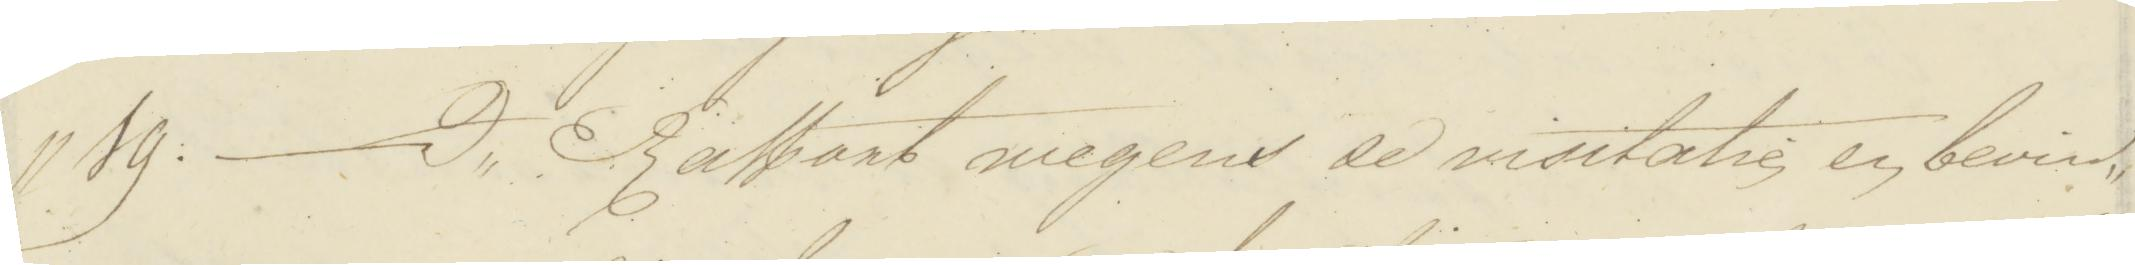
„ 19: —d„ Rapport wegens de visitatie en bevin„
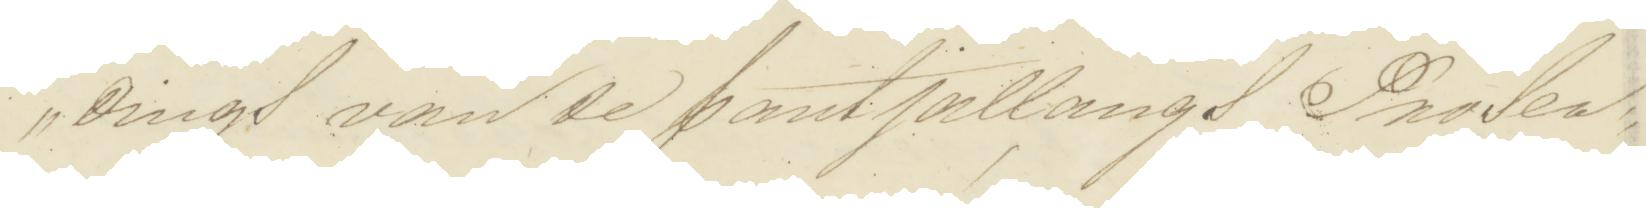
„dings van de pantjallangs Proser„
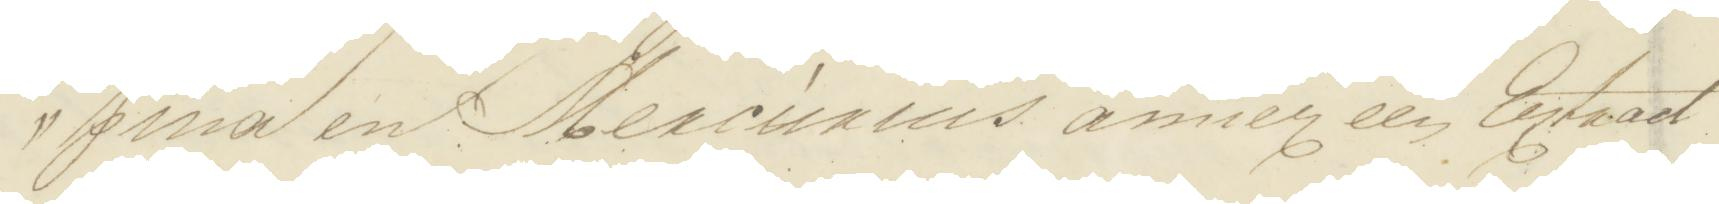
„pina en Mercurius annex een Extract
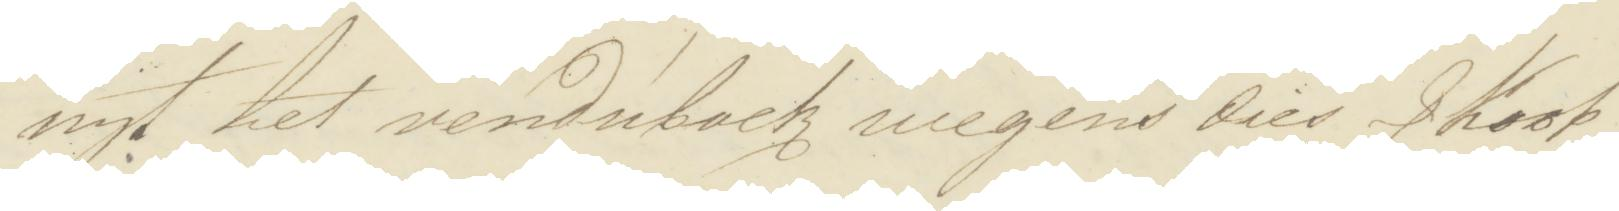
uijt het venduboek wegens dies verkoop
